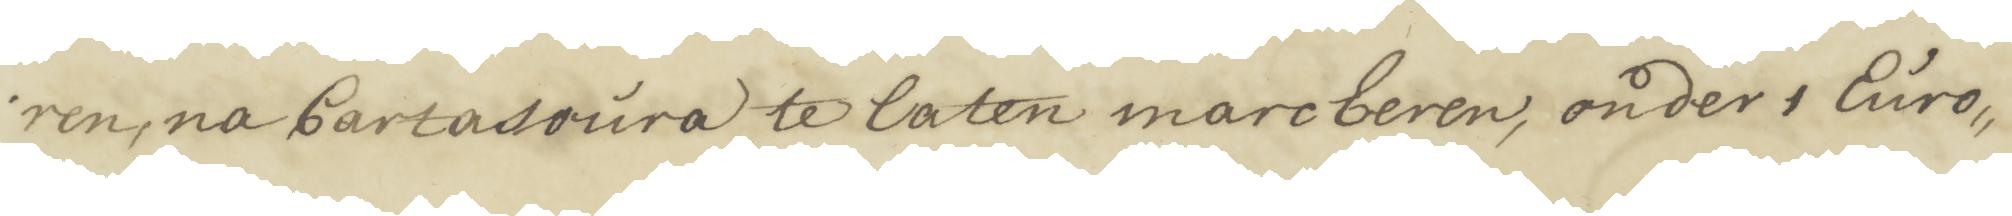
ren, na Cartasoura te laten marcheren, onder 1 Euro„
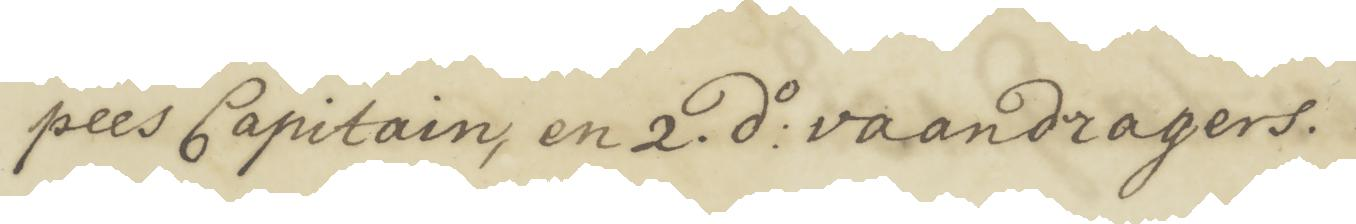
pees Capitain, en 2. d:o vaandragers.
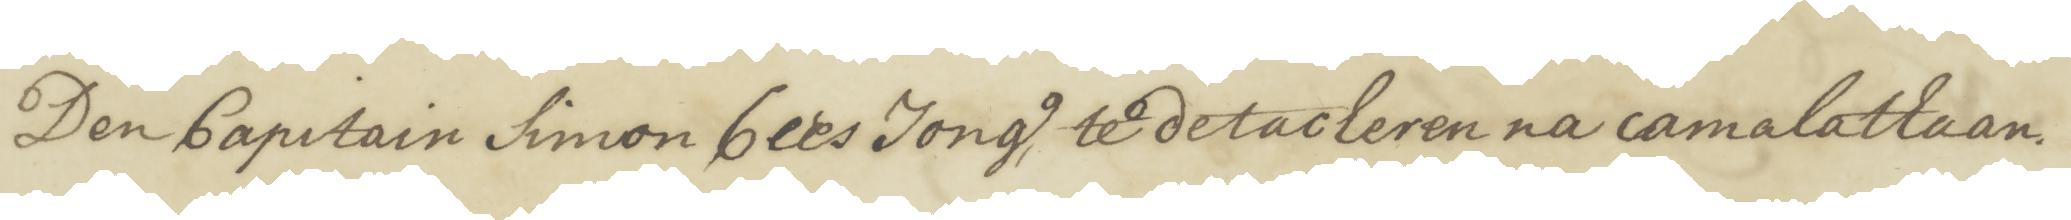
Den Capitain Simon Cees Iong te detacheren na camalathaan
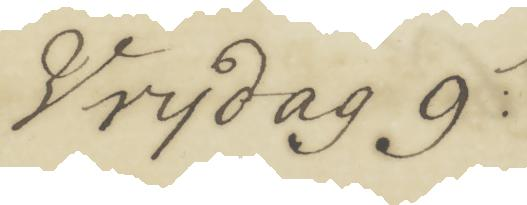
Vrydag 9:'
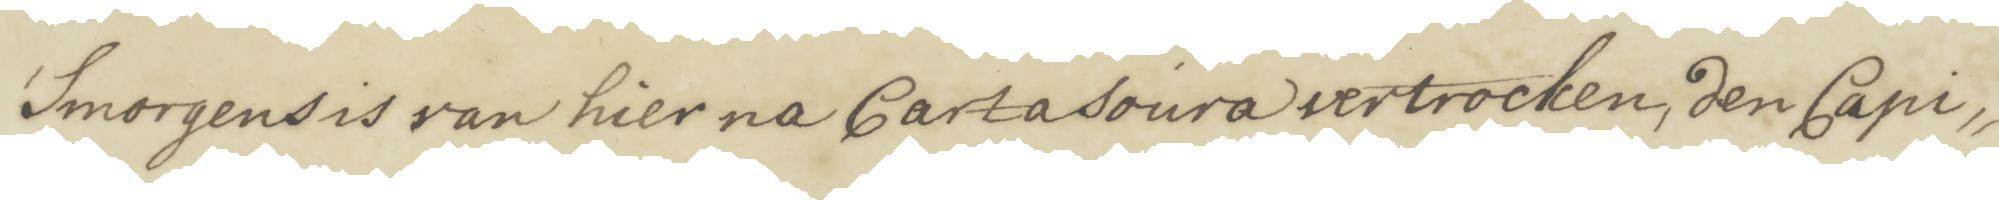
'Smorgens is van hier na Cartasoura vertrocken, den Capi„
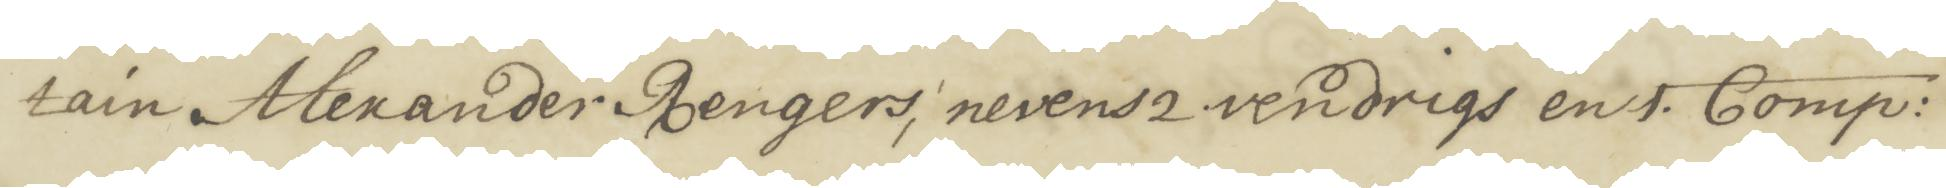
tain Alexander Rengers, nevens 2. vendrigs en 1. Comp:
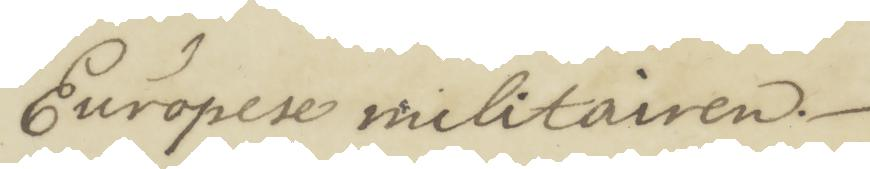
Europese militairen. —
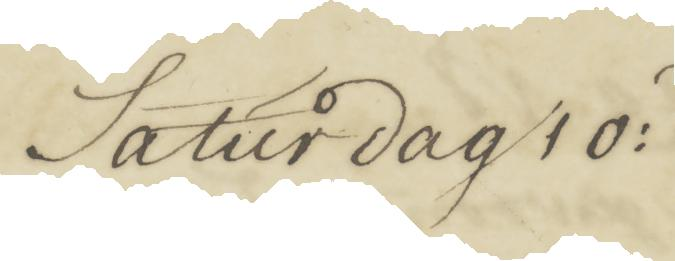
Saturdag 10:'
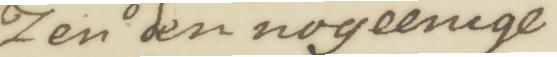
Zen den nog eenige
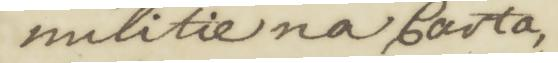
militie na Casta„
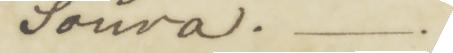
soura. —.
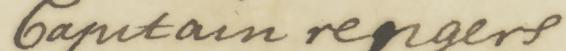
Capitain rengers
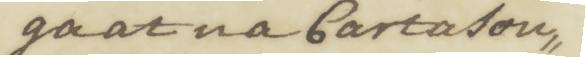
gaat na Cartasou„
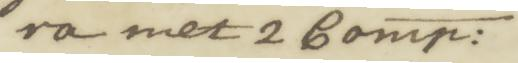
ra met 2 Comp:
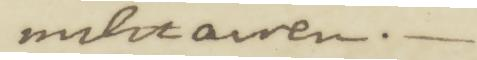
militairen. —
